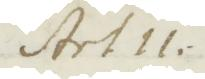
Art 11.-
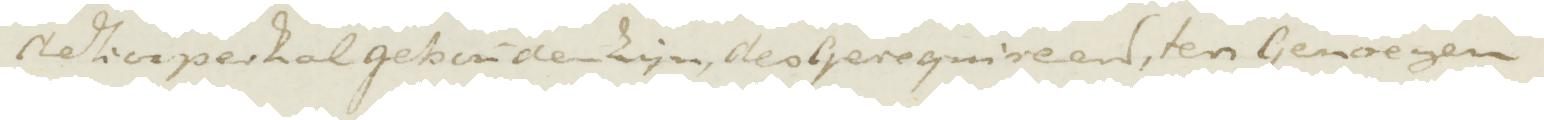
de kooper zal gehouden zijn, des Gerequireerd, ten Genoegen
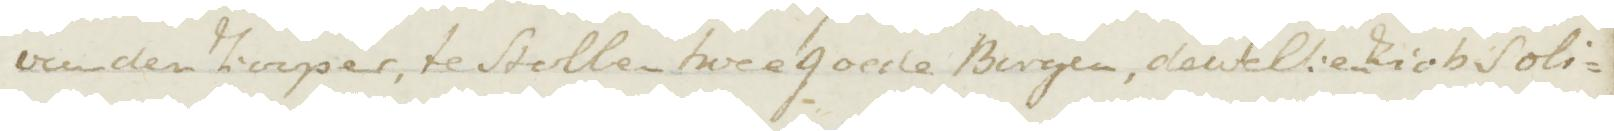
van den kooper, te stellen twee goede Borgen, dewelke zich soli=
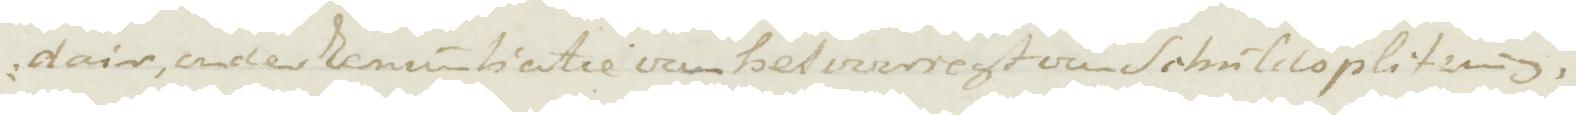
„dair, onder renuntiatie van het voorregt van Schuldsplitzing.
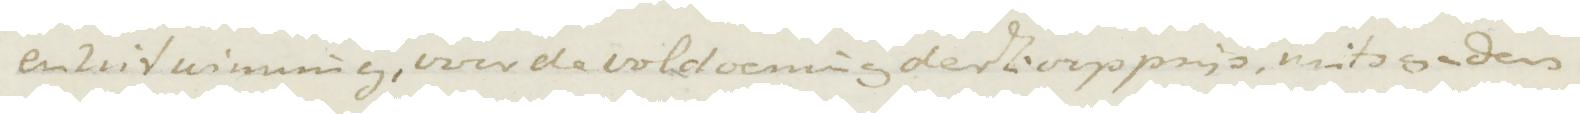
enz uitwinning, voor de voldoening der koopprijs, mitsgaders
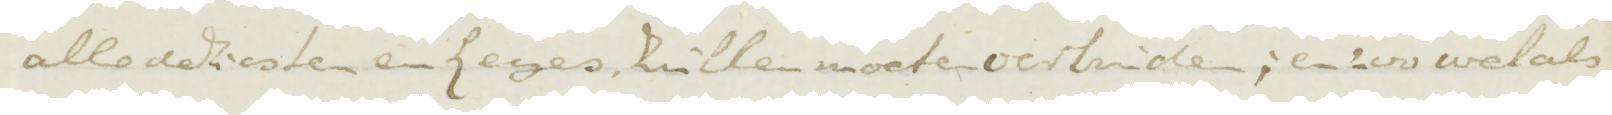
alle de kosten en Leges, zullen moeten verbinden; en zoo wel als
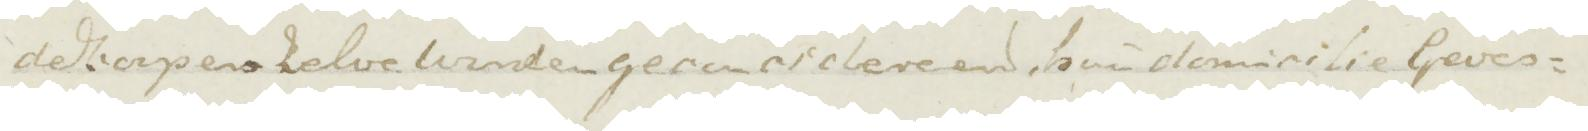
de kooper zelve worden geconcidereerd, hun domicilie Geves=
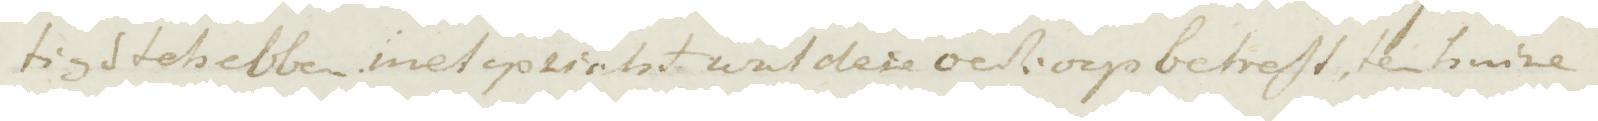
tigd te hebben, met opzicht wat deze verkoop betreft, ten huize
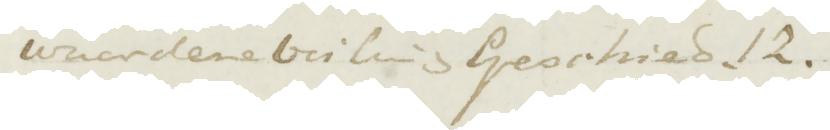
waar deze veiling Geschied 12.
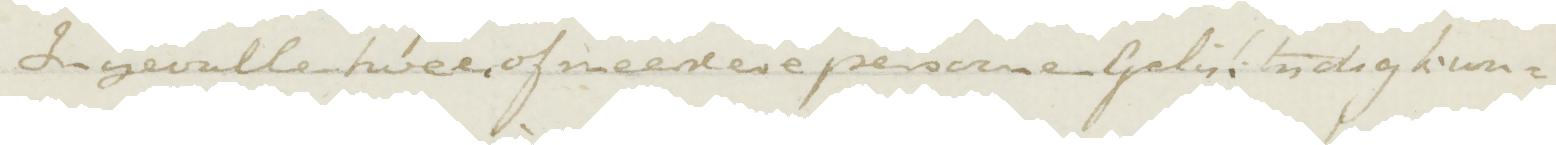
In gevallen twee of meerdere personen Gelijkmatig kun=
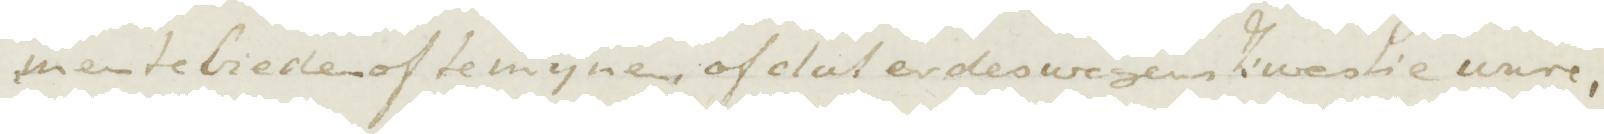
,en te bieden of te mijnen, of dat er deswegens kwestie ware,
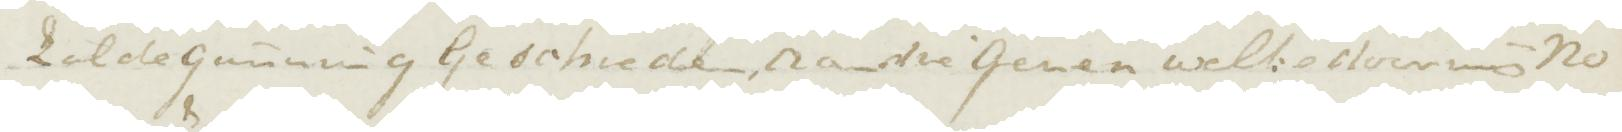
zal de gunning geschieden, aan die genen welke door mij No
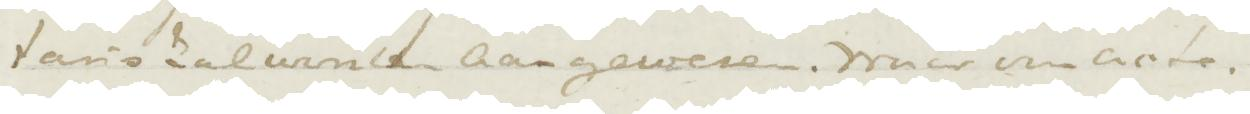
taris zal worden aangewezen. Waar van acte.
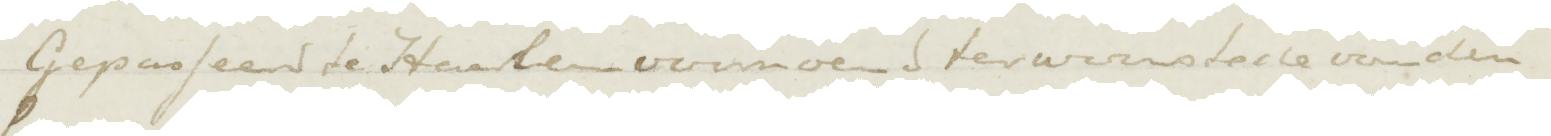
Gepasseerd te Haarlem voornoemd ter woonstede van den
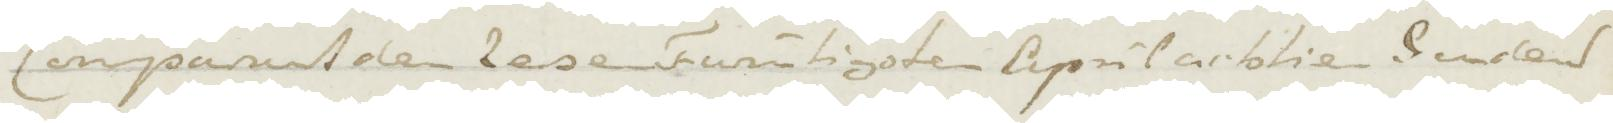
Comparant den zes en Twintigsten April achtien honderd
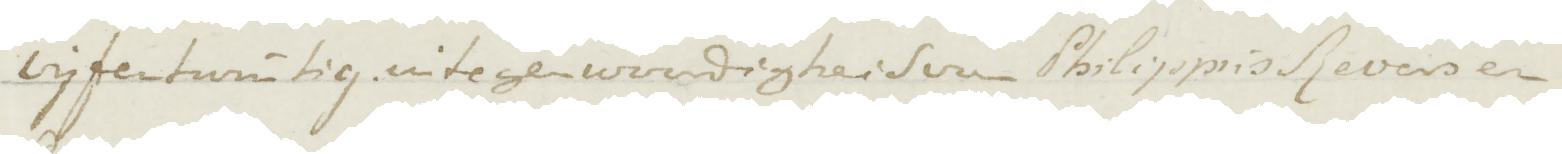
vyfentwintig, in tegenwoordigheid van Philipppus Revers en
